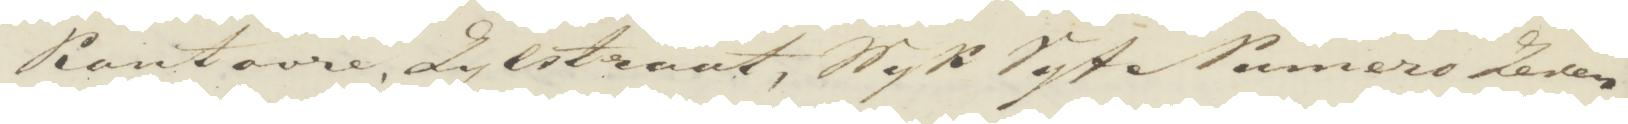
Kantoore Zylstraat, wyk vyf Numero zeven
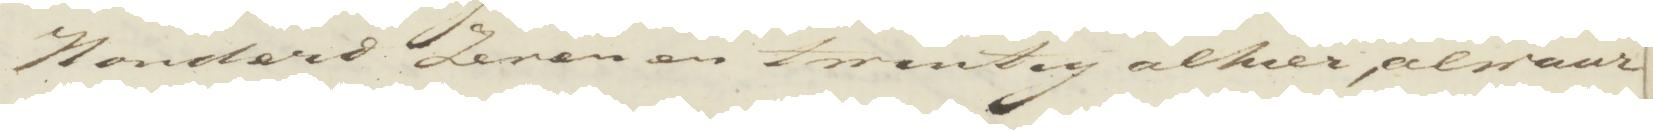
Honderd zeven en twintig alhier, alwaar
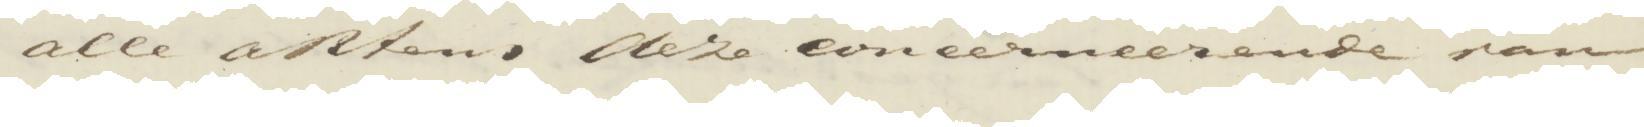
alle aktens deze coneerneerende van
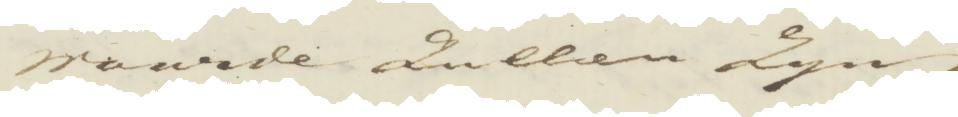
waarde zullen zyn.
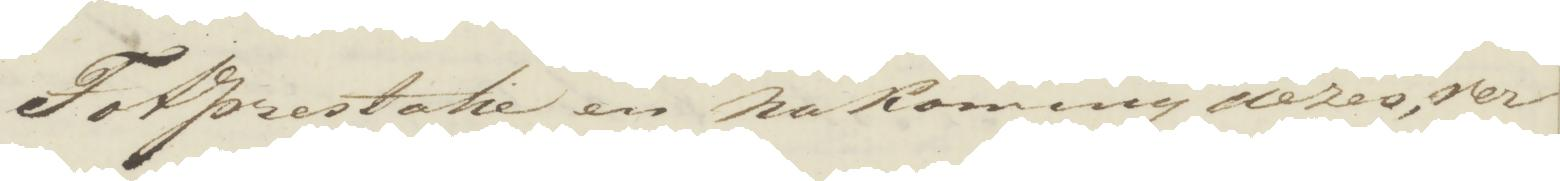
Tot prestatie en nakoming dezes, ver
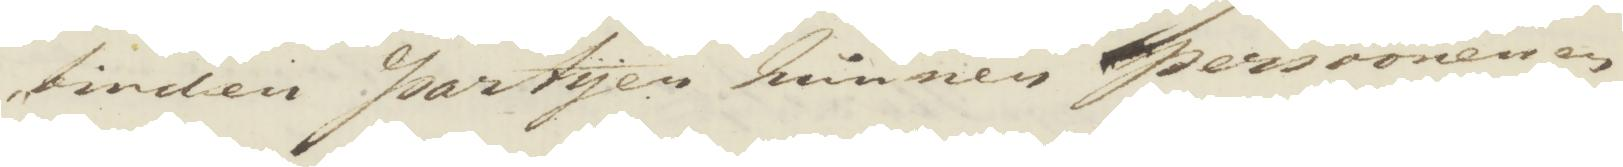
„binden partijen hunnen persoonen en
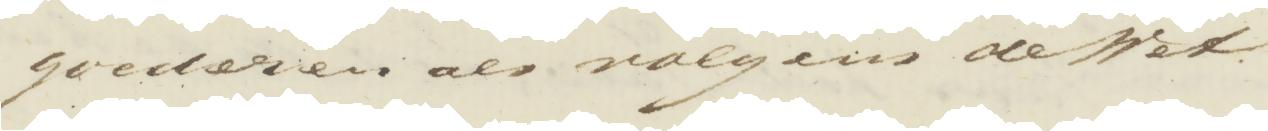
goederen als volgens de wet
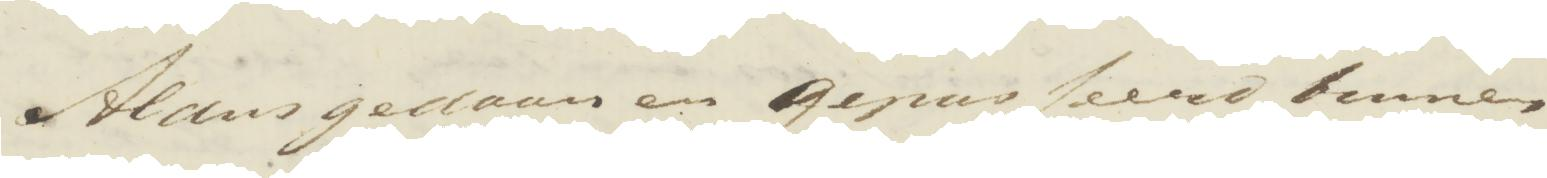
Aldus gedaan en gepasseerd, binnen
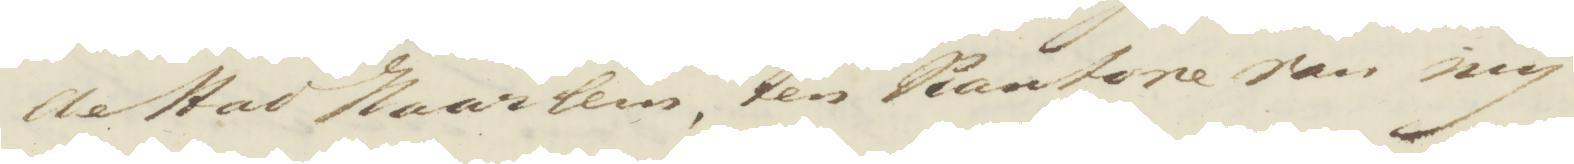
de stad Haarlem, ten Kantore van my
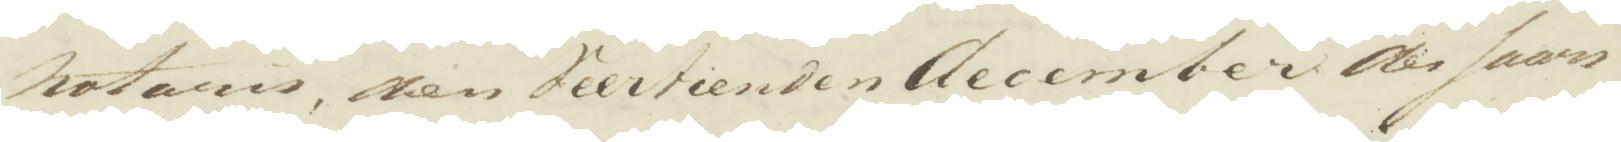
notaris, den Veertienden December des jaars
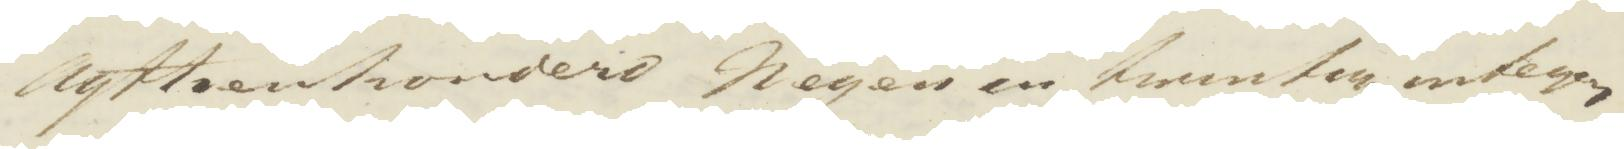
agttienhonderd negen en twintig, in tegen
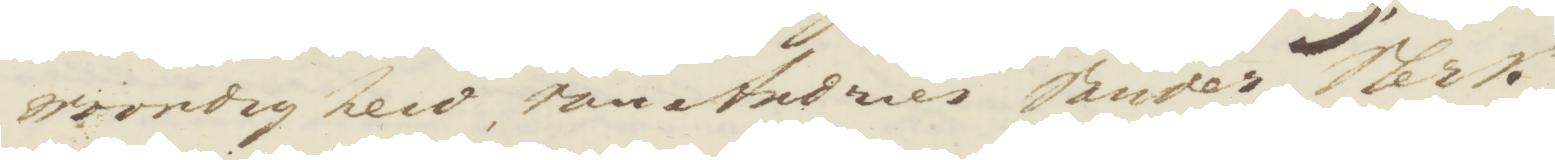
woordig heid, van Andries vander Vlerk
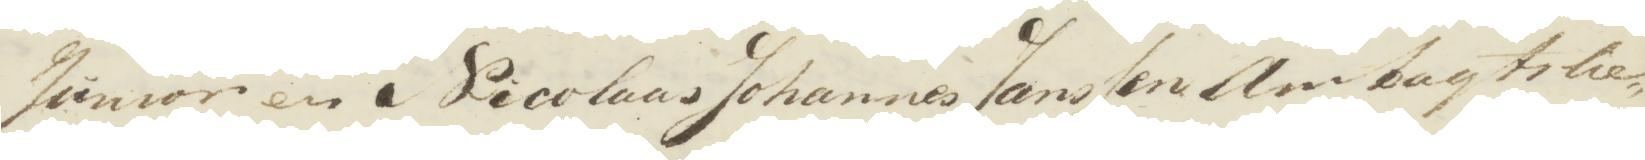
Junior en Nicolaas Johannes Janssen Ambagtslie
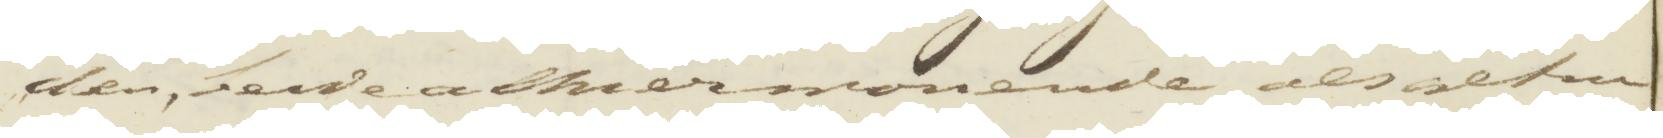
den, beide alhier wonende, als getui
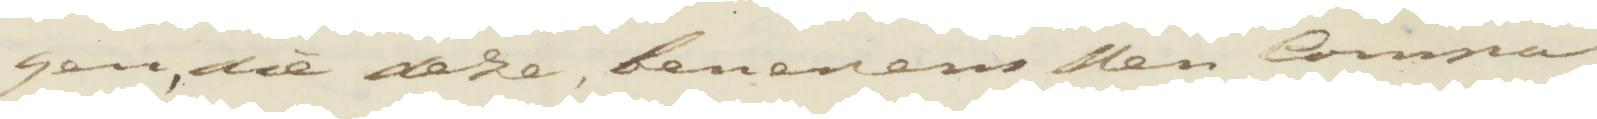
gen, die deze, benevens van Compa
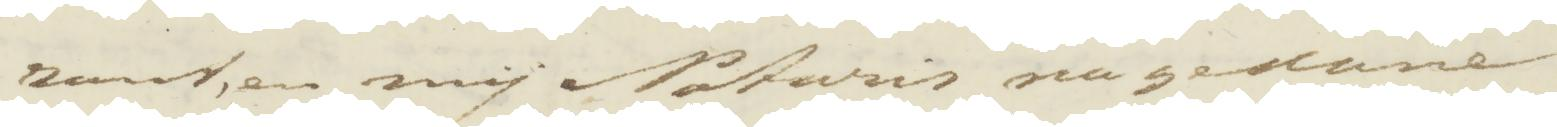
rant, en mij Notaris na gedane
